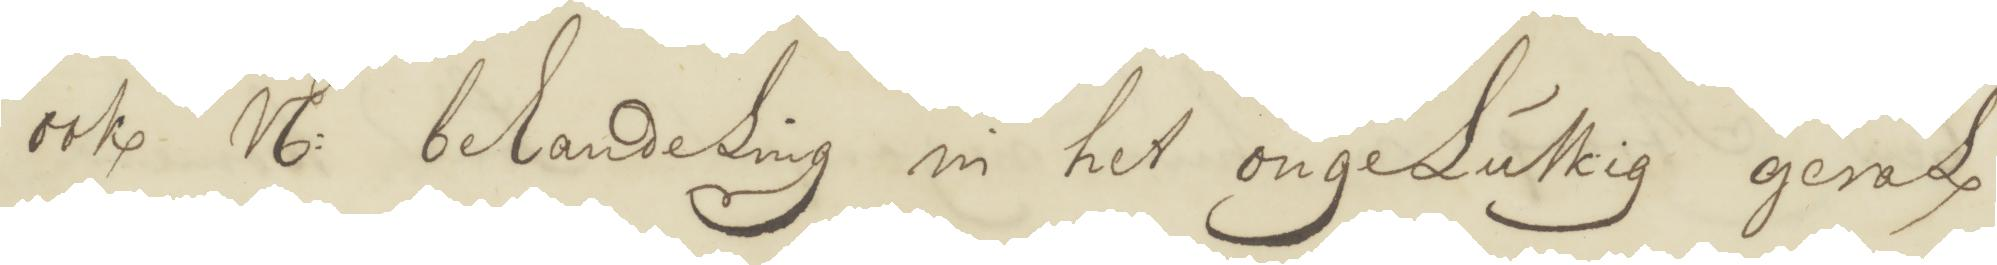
ook VE: behandeling in het ongelukkig geval
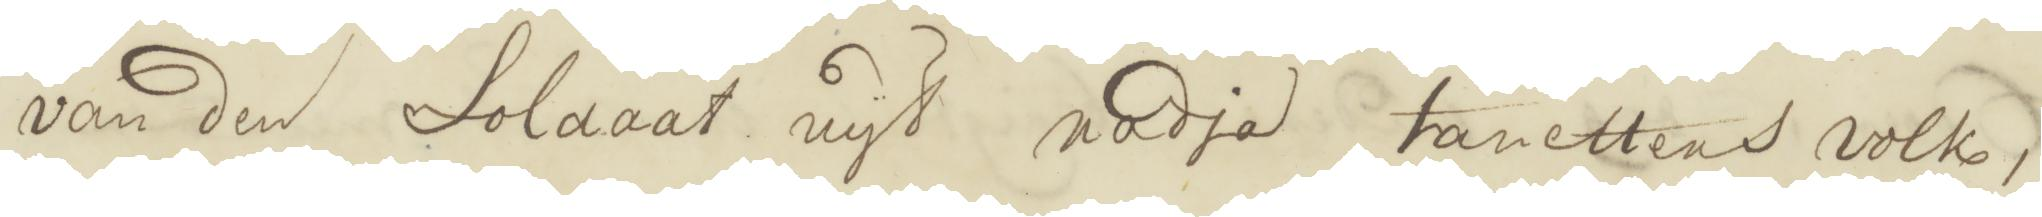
van den soldaat uijt radja tanetters volk,
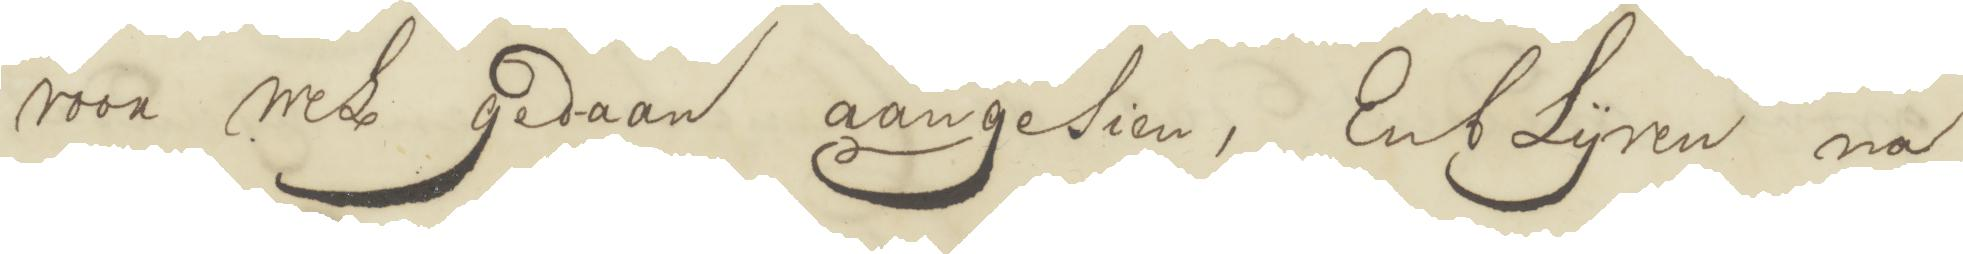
voor wel gedaan aangesien, En blijven na
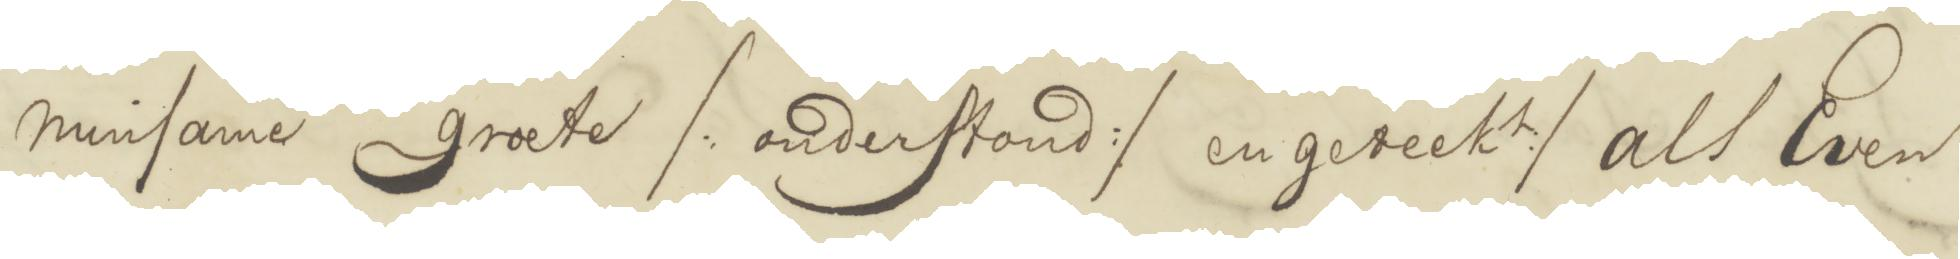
minsame groete /:onderstond:/ en geteekt./ als Even
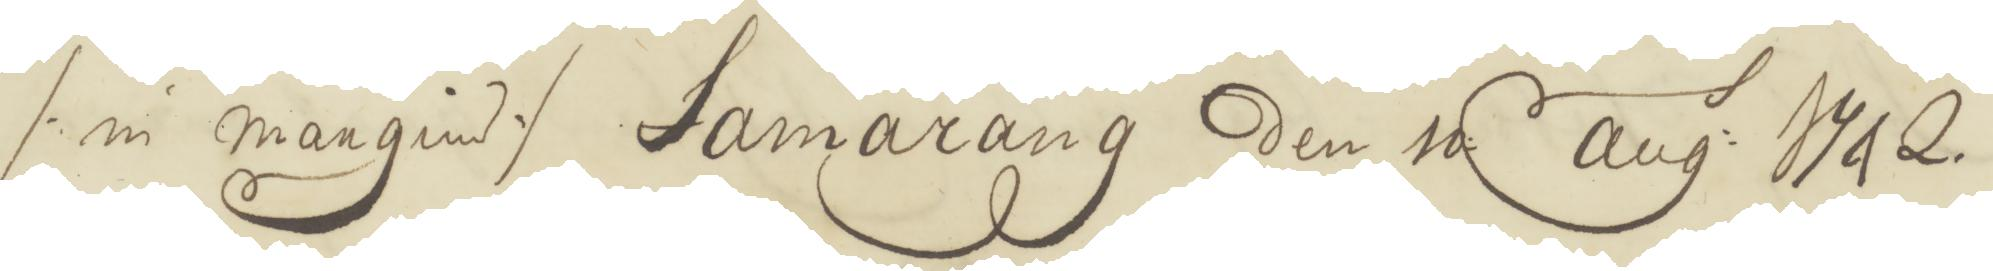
/:in margine./ samarang den 10: aug:s 1742.
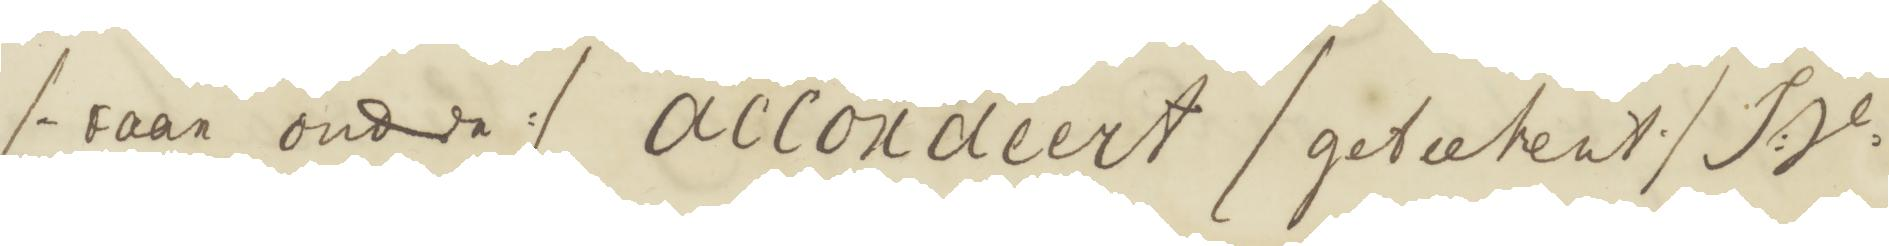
/.daar onder:/ accordeert /geteekent./ I: V:
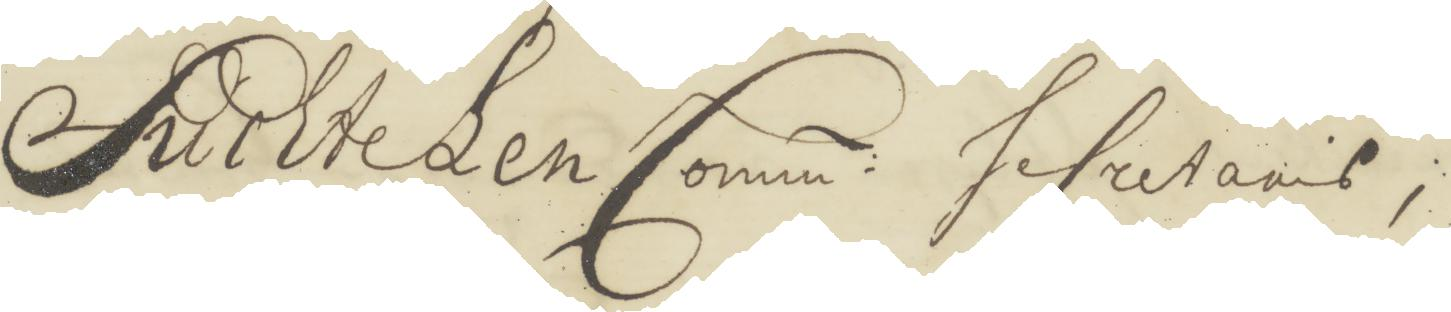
Suchtelen Comm: secretaris,:
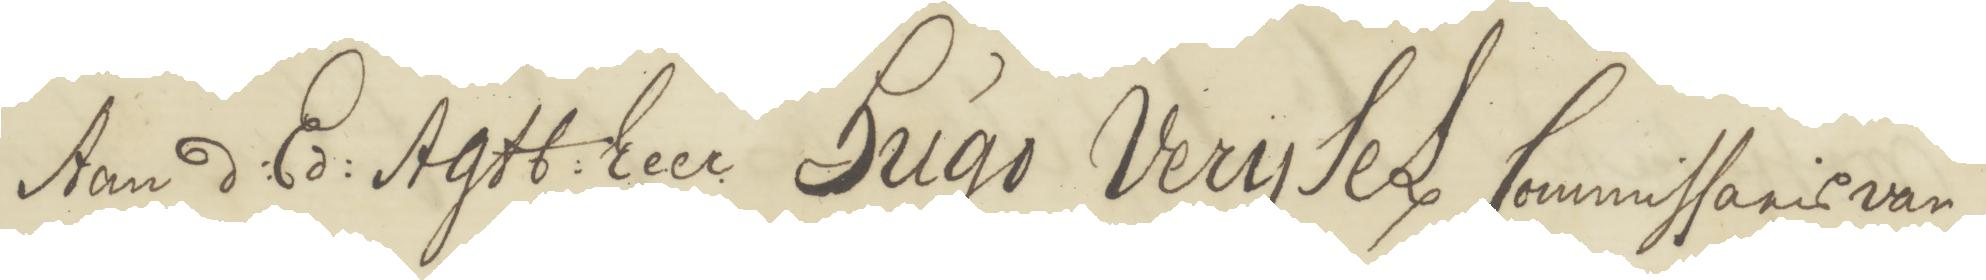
Aan d: Ed: Agtb: heer Hugo Verijsel Commissaris van
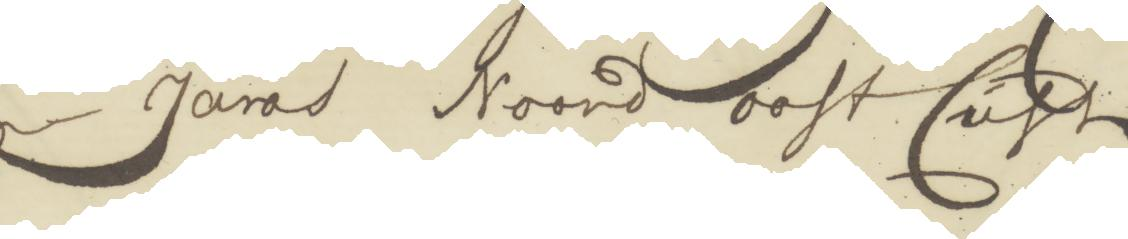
Javas Noord oost Cust
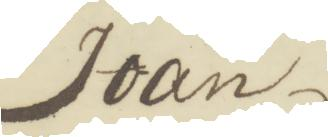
Ioan
